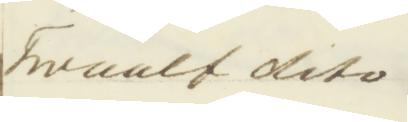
Twaalf dito
